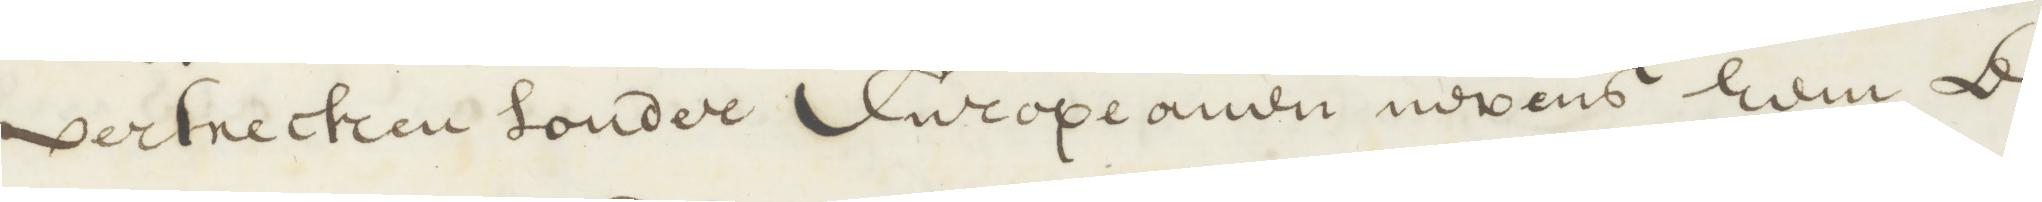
vertrecken sonder Europeanen nevens hem te
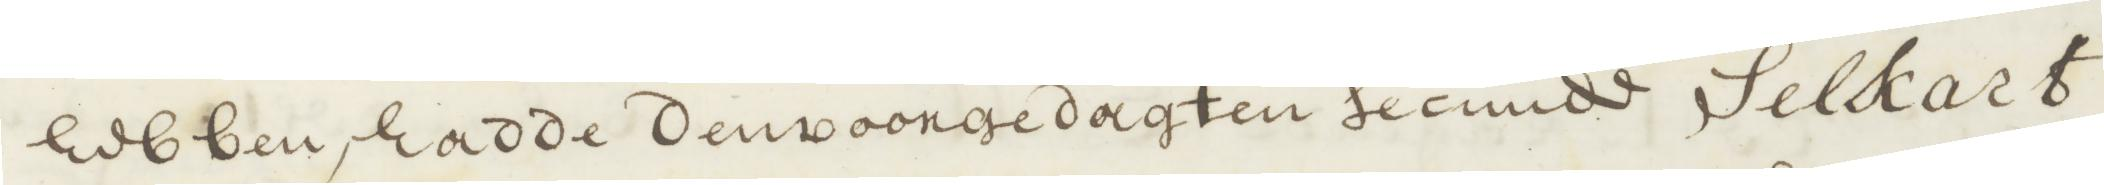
hebben, hadde den voorgedagten secunde Selkart
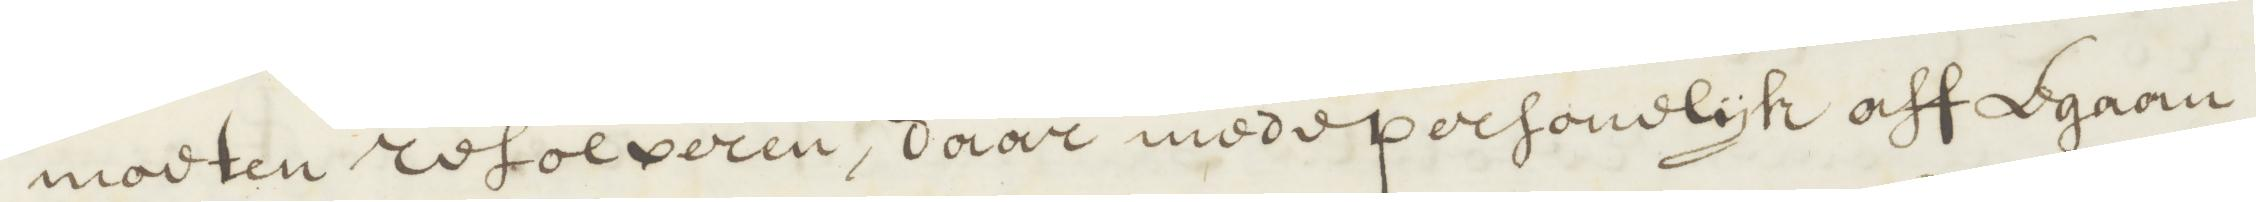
moeten resolveren, daar mede personelijk aff tegaan
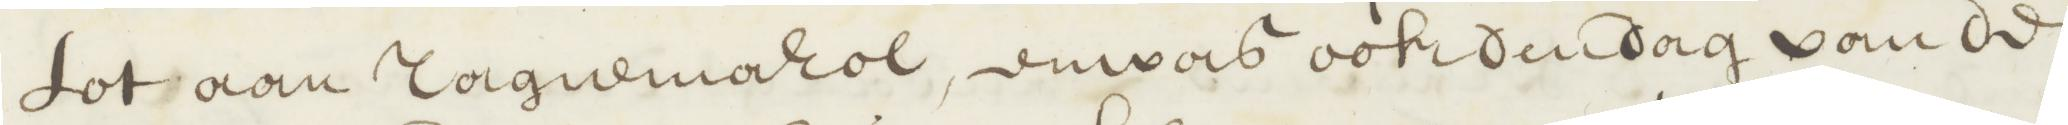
tot aan ragiemahol, en was ook den dag van de
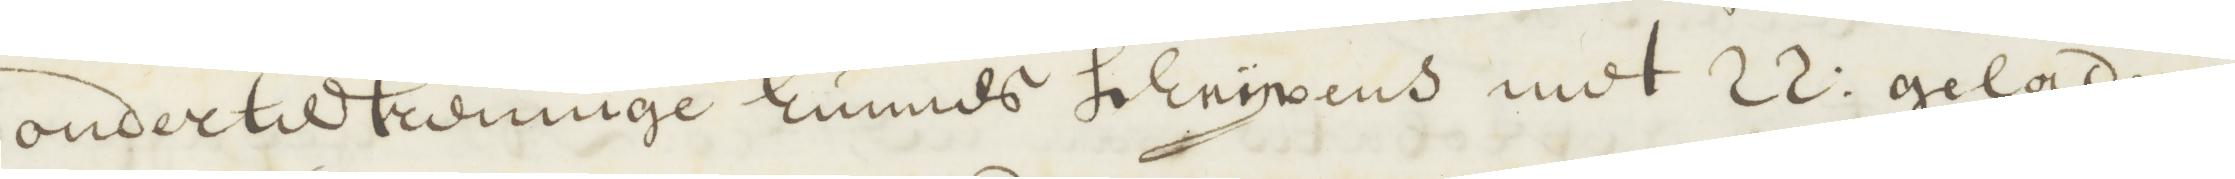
onderteekeninge hunnes schrijvens met 22: geladen
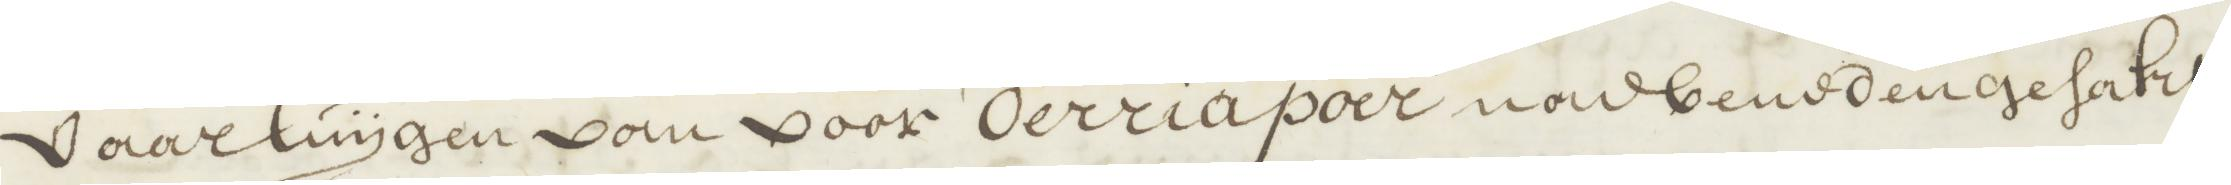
vaartuijgen van voor derriapoer nae beneden gesakt,
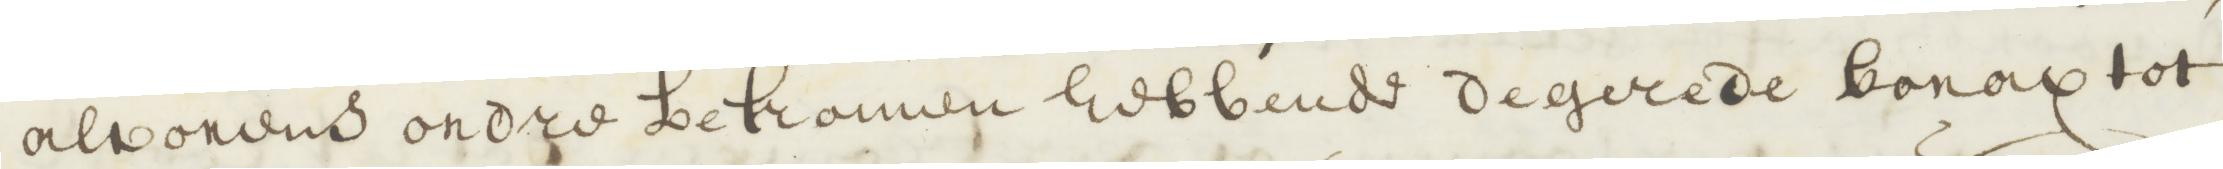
alvorens ordre bekomen hebbende de gerede bonax tot
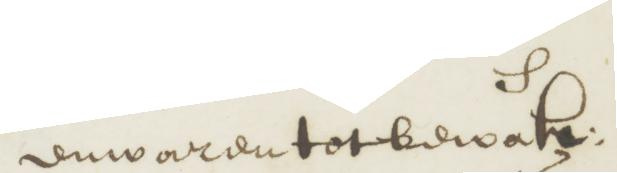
en waren tot bewak:
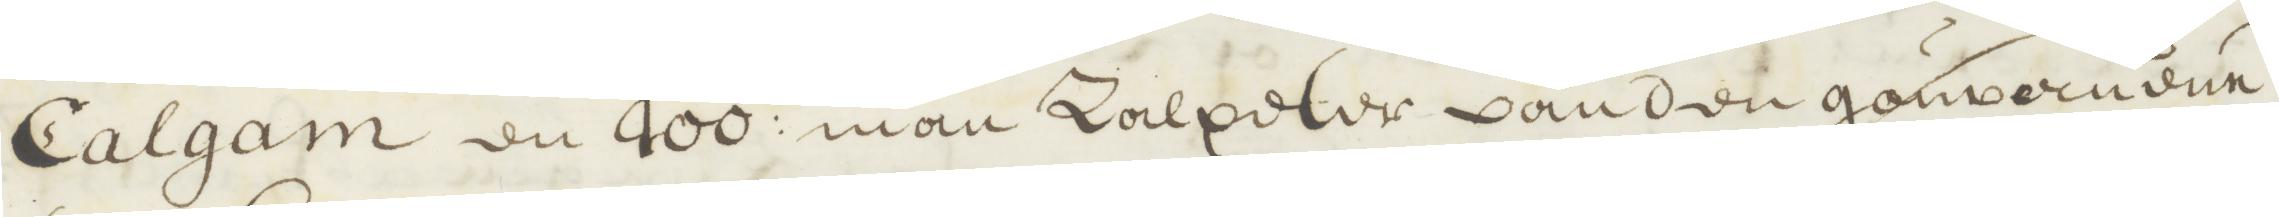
Calgam en 400: man Zalpeter van den gouverneur
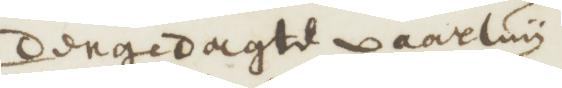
der gedagte vaartuij
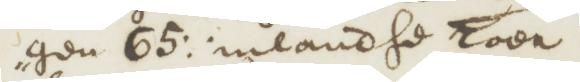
„gen 65: inlandse roer
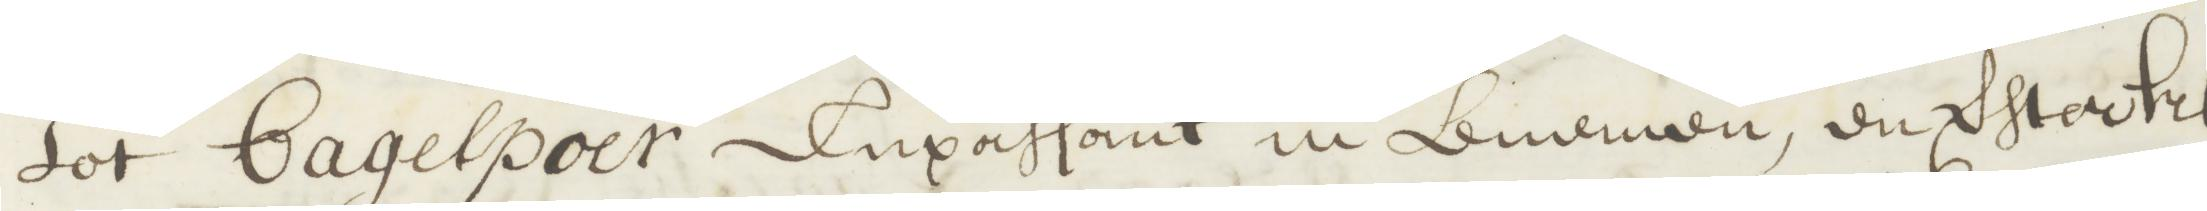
tot bagespoer En passant in tenemen, en versterkt
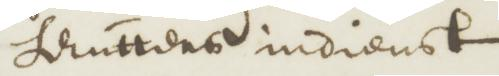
schutters in dienst
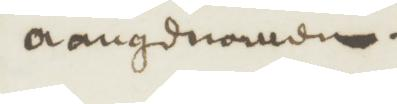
aangenomen.
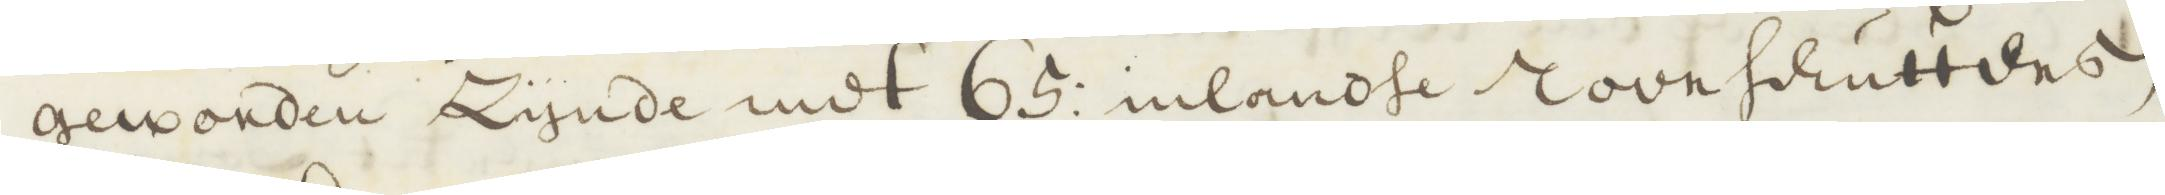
geworden zijnde met 65: inlandse roer schutters,
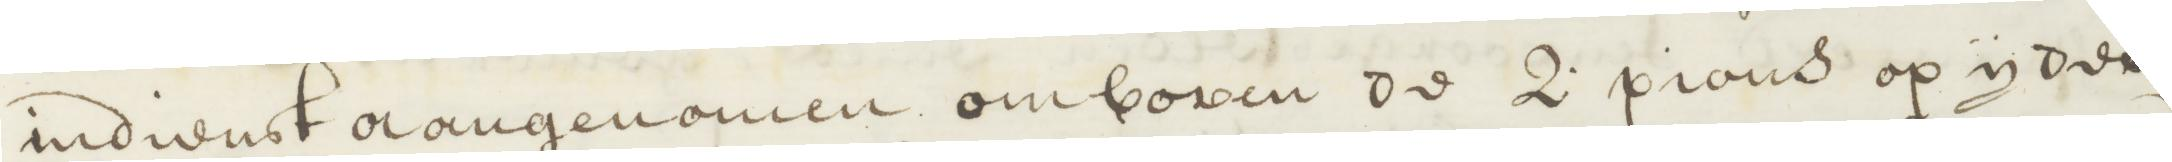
in dienst aangenomen om boven de 2: pious op ijder
